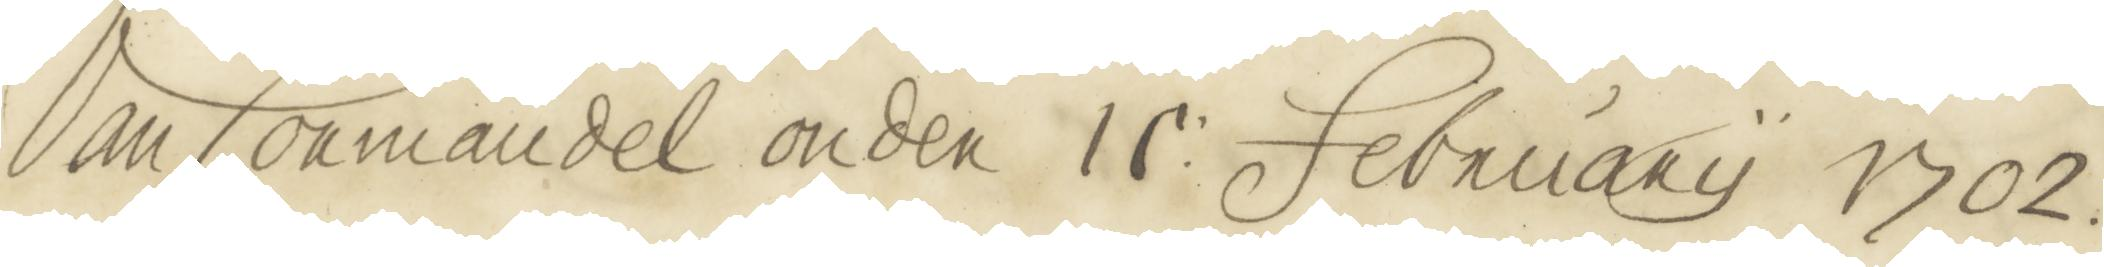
Van Cormandel onder 15: Februarij 1702.
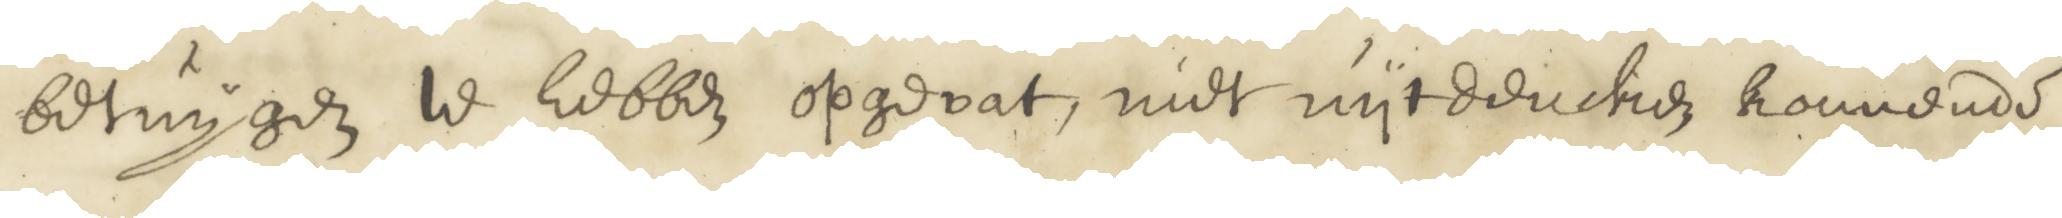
betuijgen te hebben opgevat, niet uijtdencken konnende,
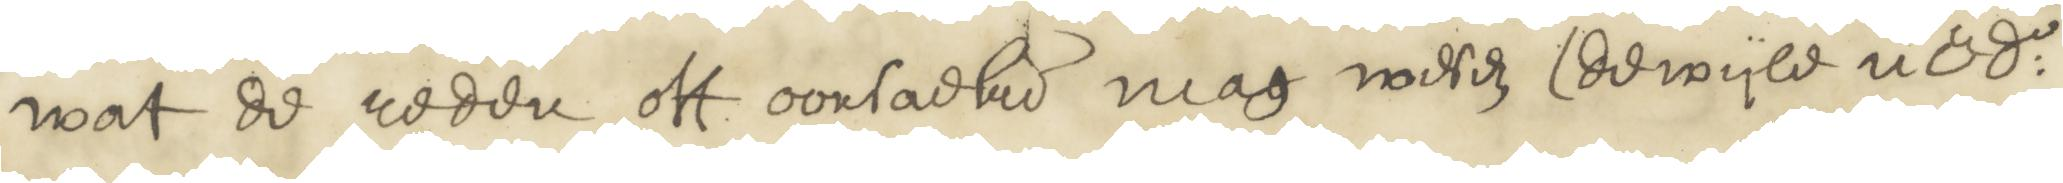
wat de reden off oorsaeke mag wesen (dewijle uEd:e
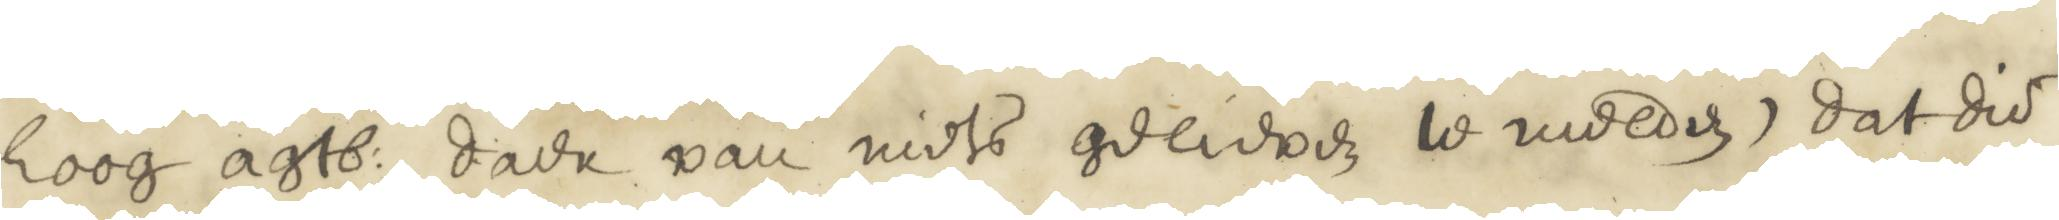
hoog agtb: daer van niets gelieven te melden) dat die
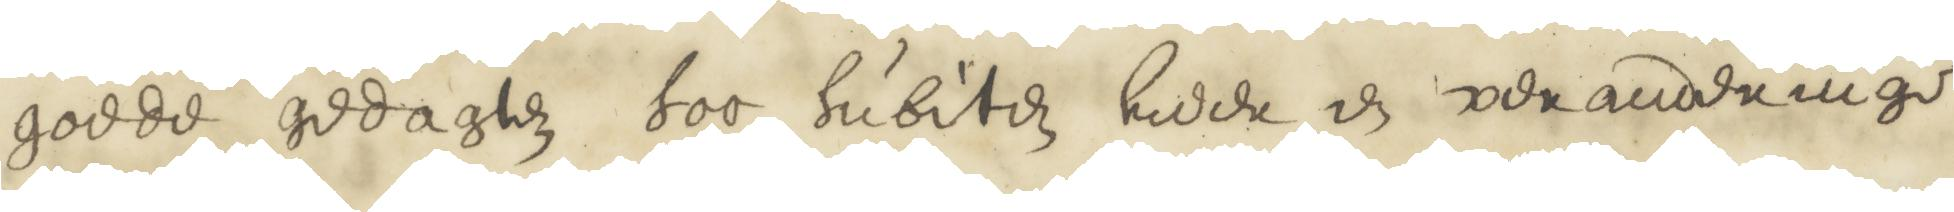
goede gedagten soo subiten keer en veranderinge
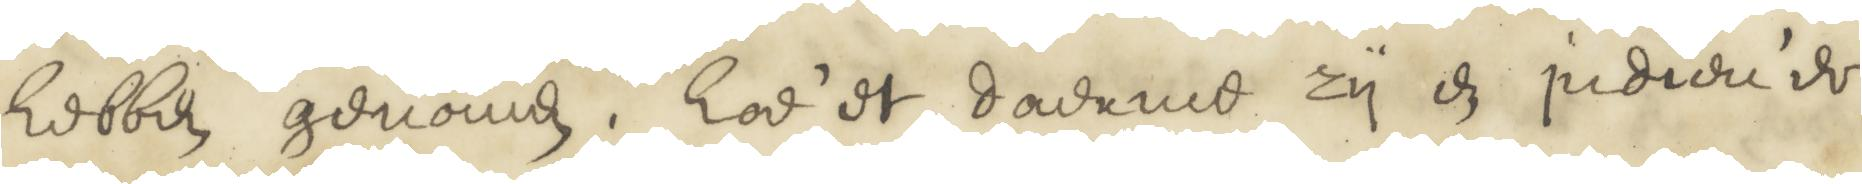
hebben genomen, hoe 'et daerme zij en jndien 'er
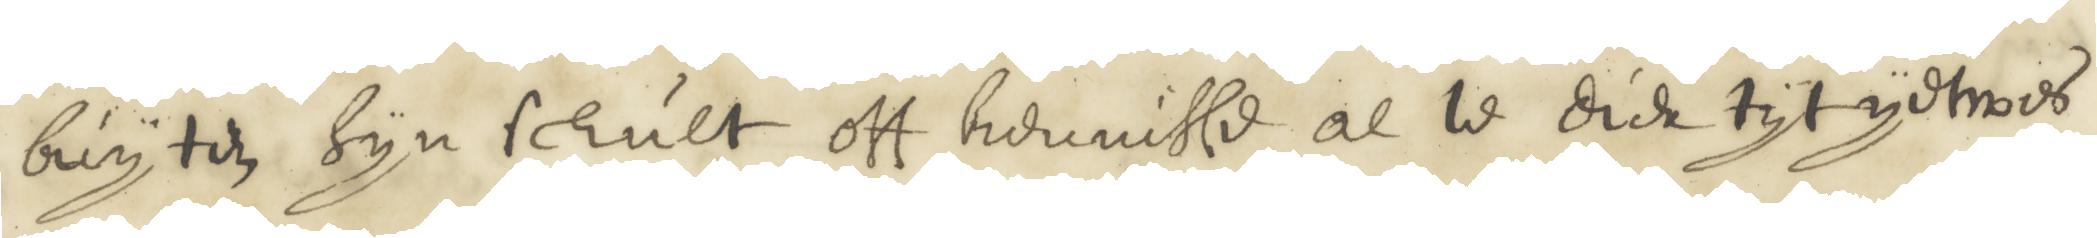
buijten sijn schult off kennisse al te dier tijt ijetwes
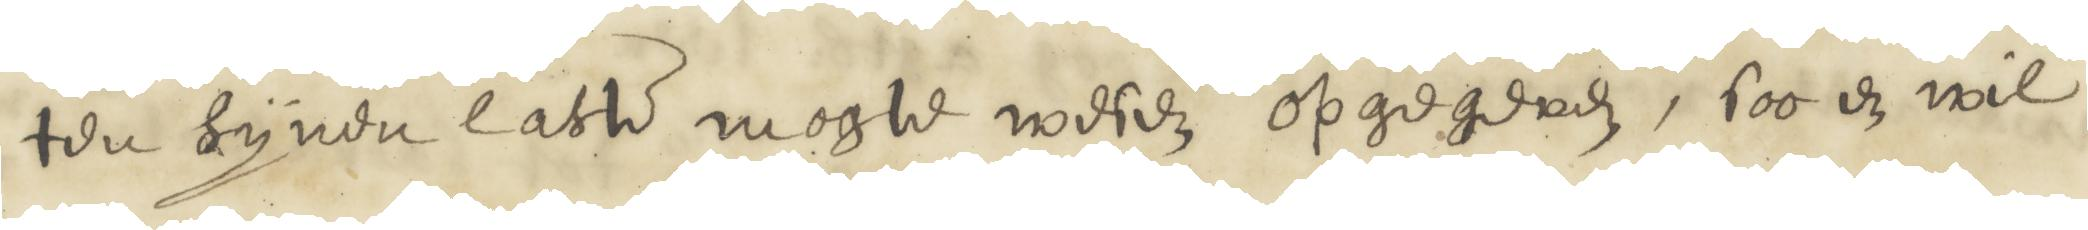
ten sijnen laste mogte wesen op gegeven, soo en wil
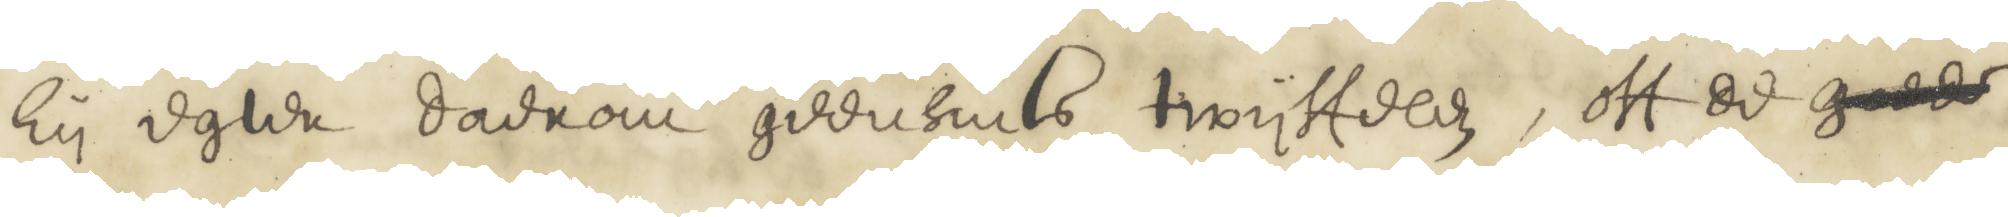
hij egter daerom geensints twijffelen, off de goede
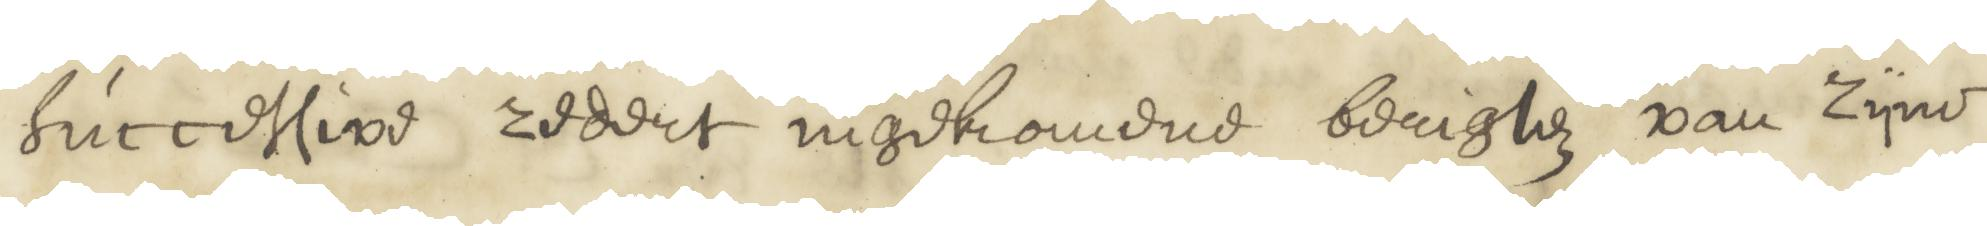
successive zedert ingekomene berigten van zijne
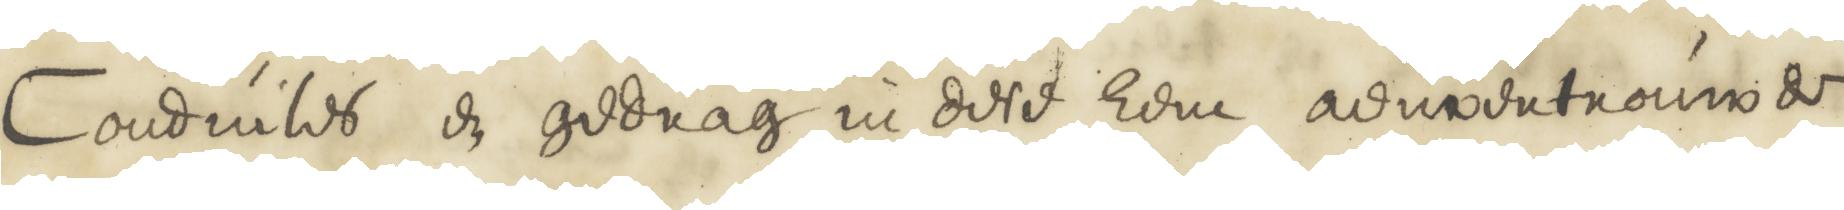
Conduites en gedrag in dese hem aenvertrouwde
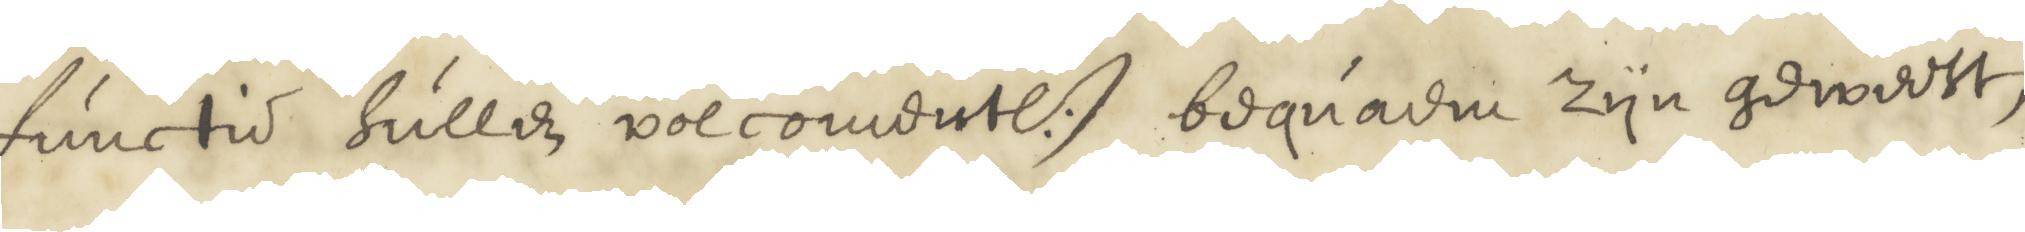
functie sullen volcomentlijk bequaem zijn geweest,
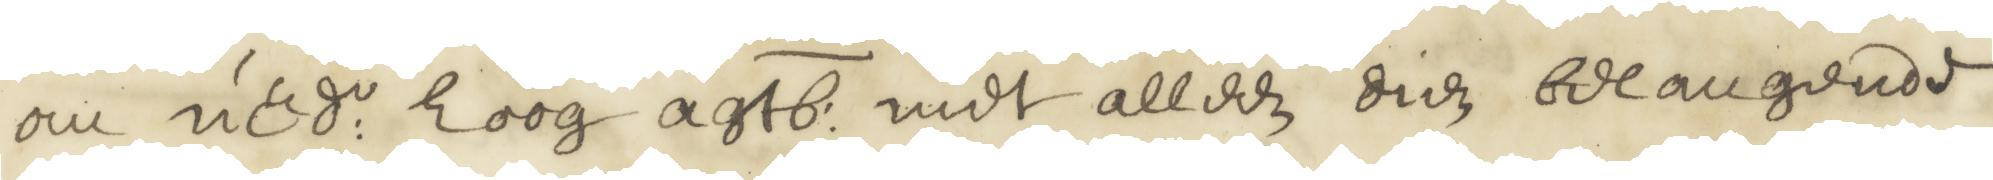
om uEd:e hoog agtb: niet alleen dien belangende
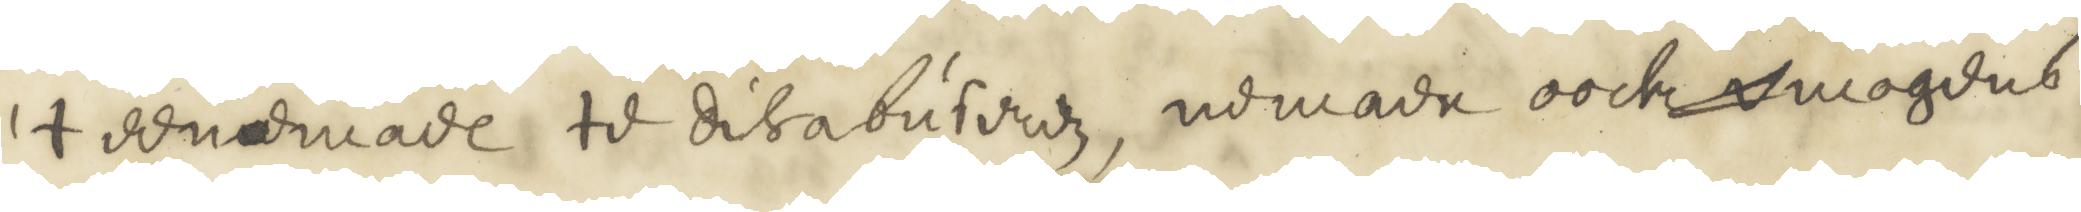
’t eenemael te disabuseren, ne maer oock vermogens
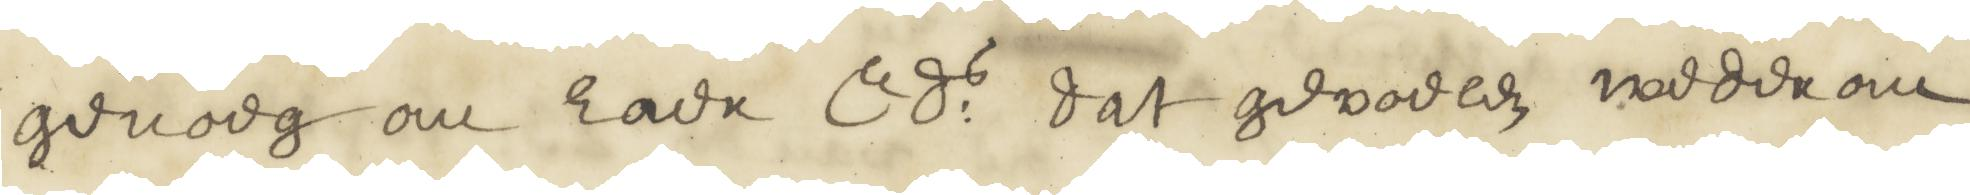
genoeg om haer Ed:s dat gevoelen wederom
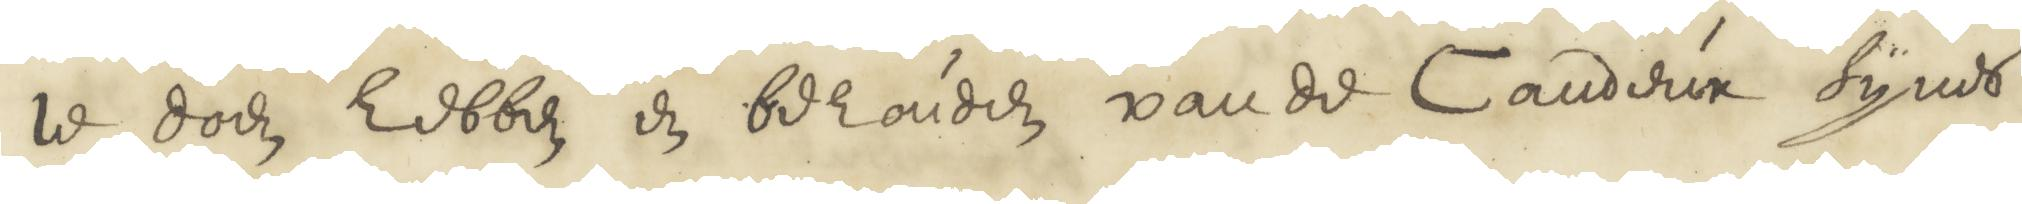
te doen hebben en behouden van de Candeur sijnes
